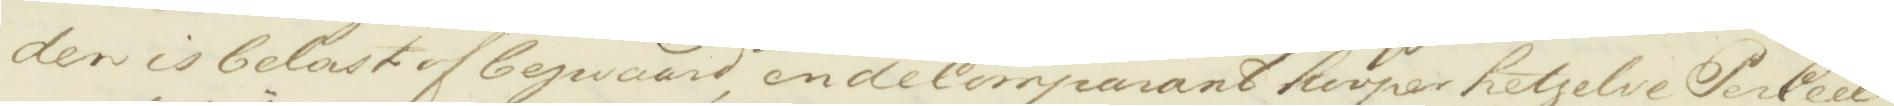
den is belast of bezwaard, en de Comparant kooper hetzelve PerCeel
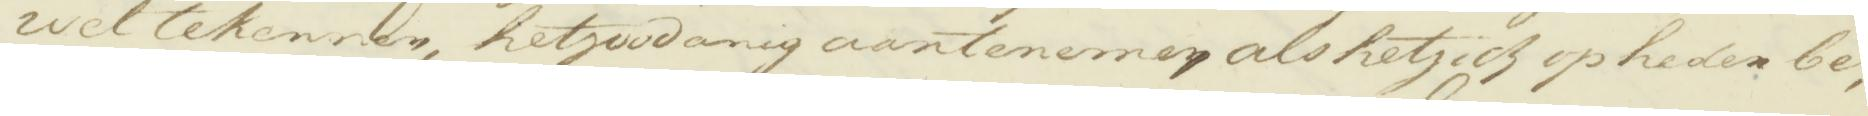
wel tekennen, hetzoodanig aan tenemen als hetzich op heden be,
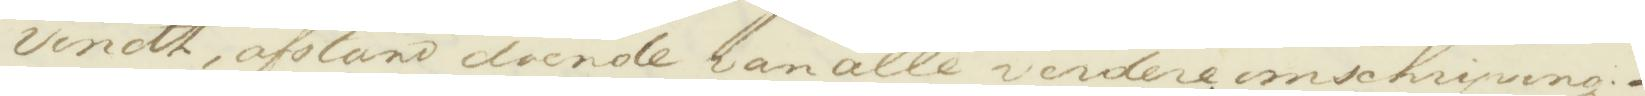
vindt, afstand doende van alle verdere omschrijving.-
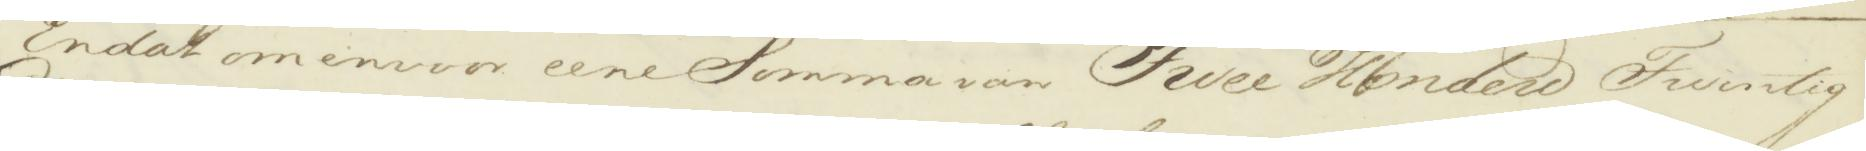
En dat om en voor eene Somma van Twee Honderd Twintig
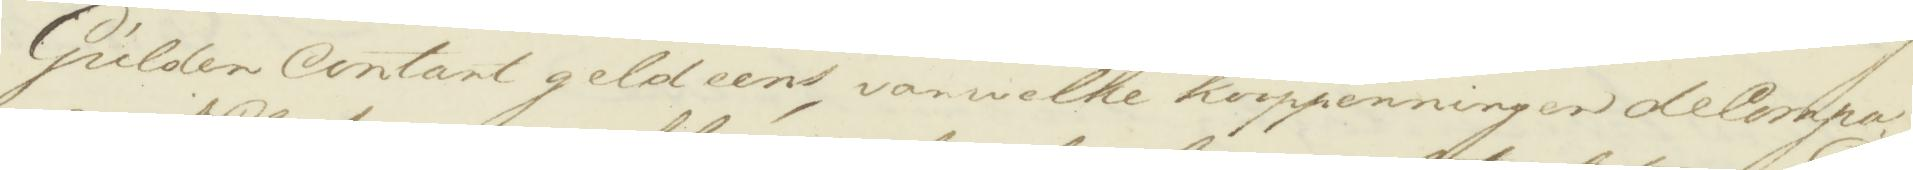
Gulden Contant geld eens, van welke kooppenningen de Compa
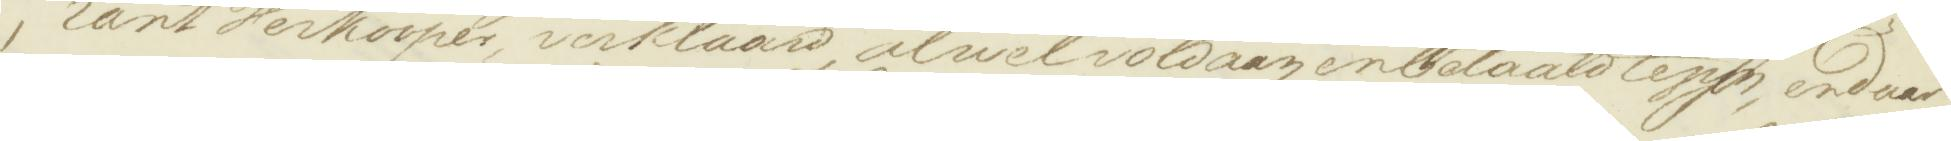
, rant Verkooper, verklaard, alwel voldaan enbetaald tezyn, en daar
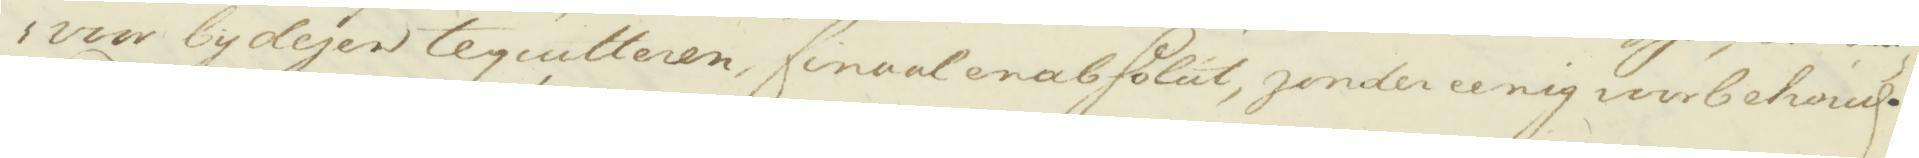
„ voor bij dezen tequitteren, finaal en absolut, zonder eenig voor behoud.
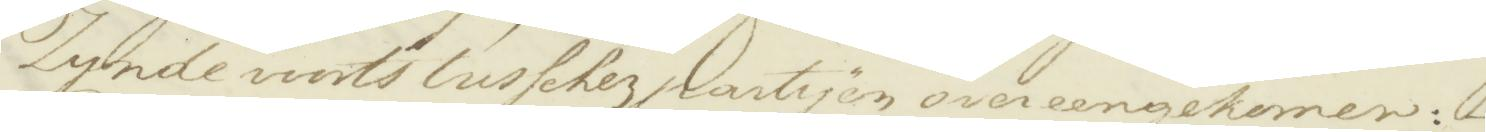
Zynde voorts tusschen partijen over eengekomen:
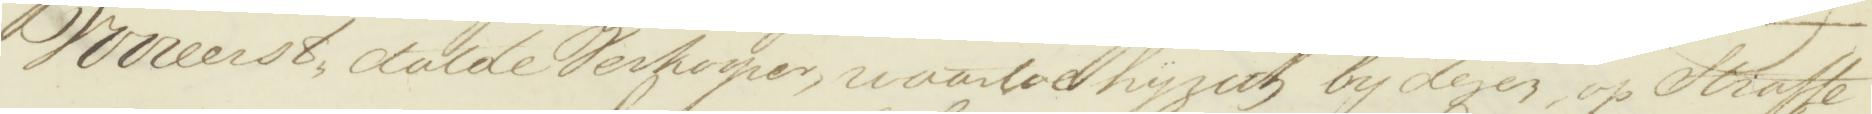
Vooreerst, datde Verkooper, waartoe hij zich by dezes, op Straffe
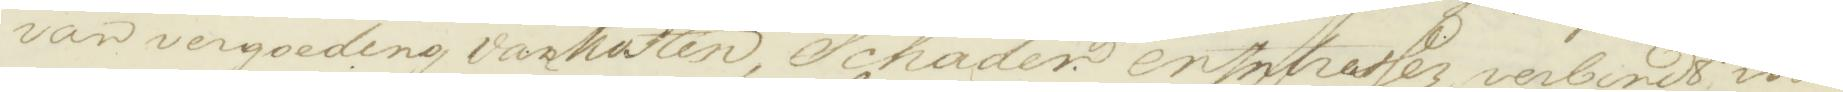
van vergoeding van kosten, Schaden en Intresses, verbindt, voor
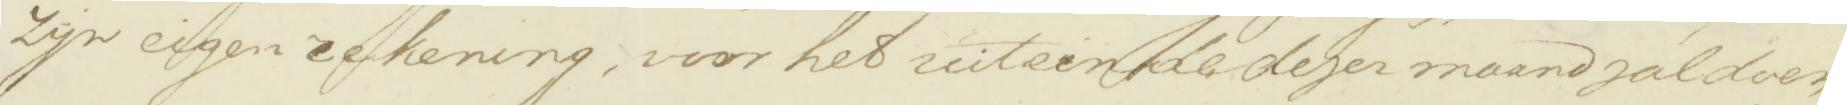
zijn eigen rekening, voor het uiteinde dezer maand zal doen
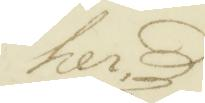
her
